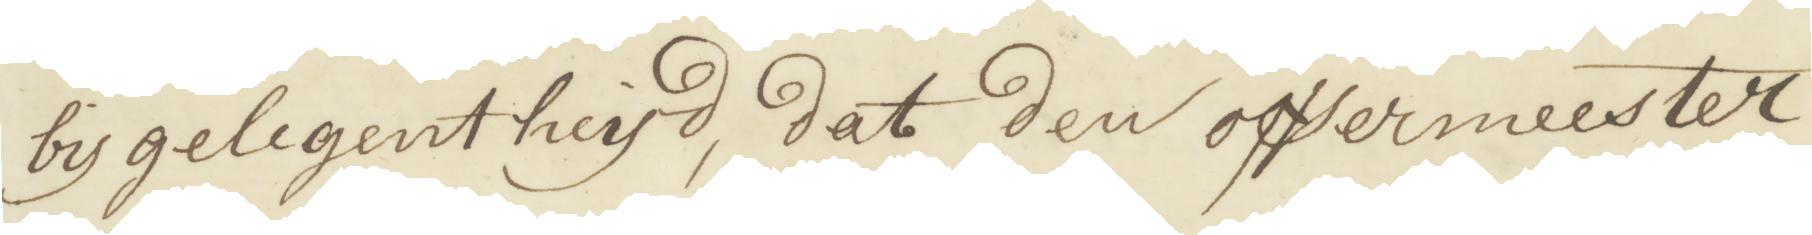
bij gelegentheijd, dat den oppermeester
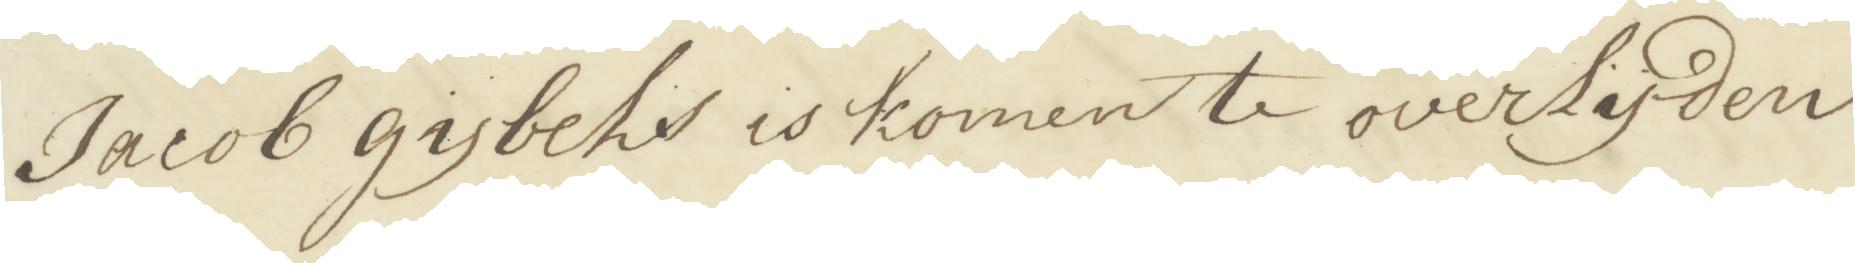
Iacob gijbels is komen te overlijden
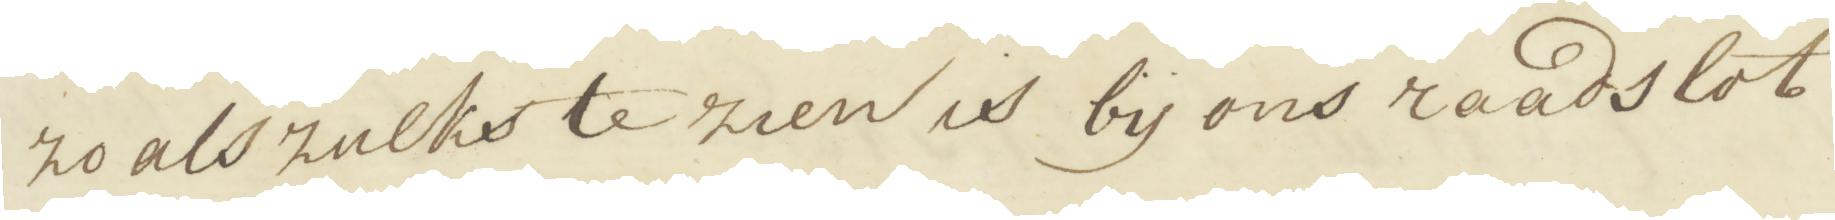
zo als zulks te zien is bij ons raads lot
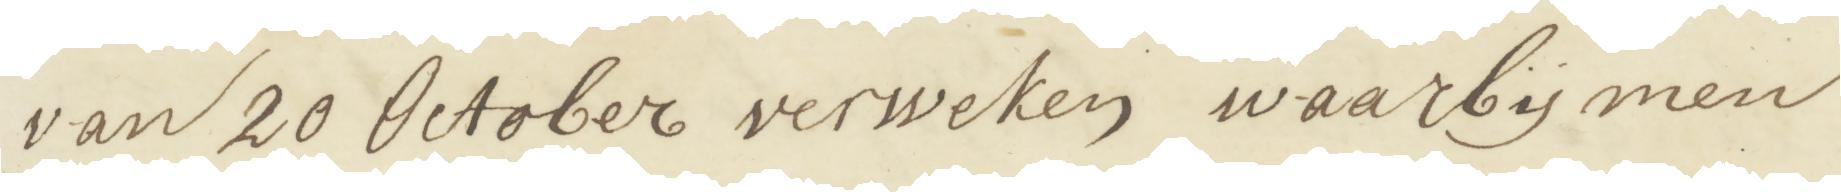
van 20 October verweken waarbij men
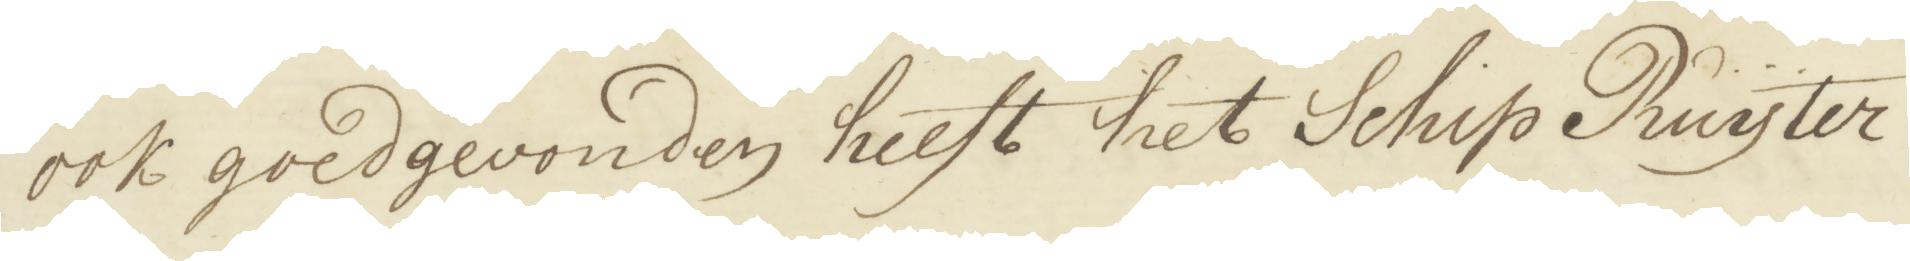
ook goedgevonden heeft het schip Ruijter
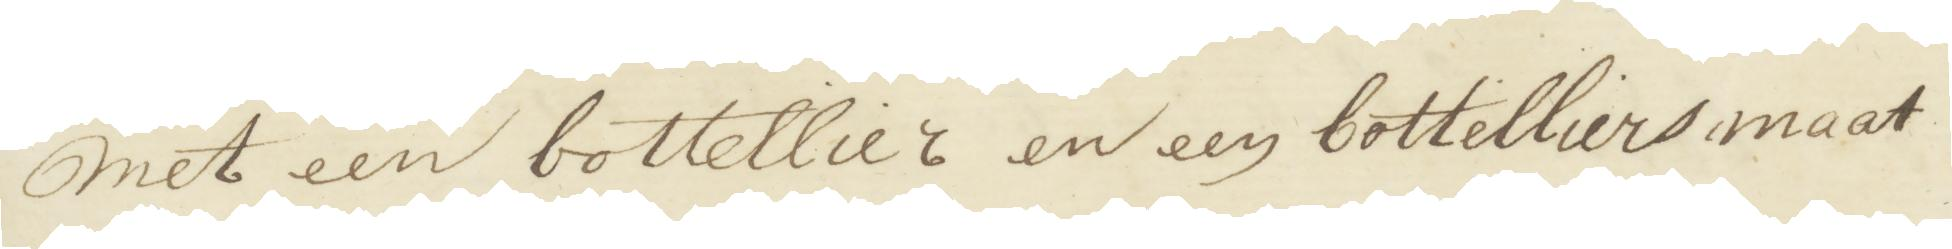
met een bottellier en een bottelliers maat
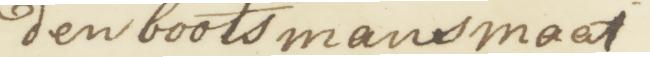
den bootsmansmaat
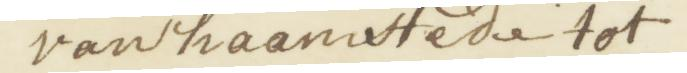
van haamstede tot
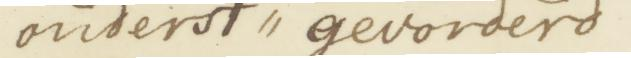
onderst„n gevorderd
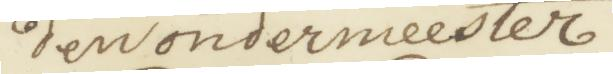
den ondermeester
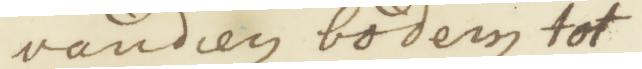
vandien bodem tot
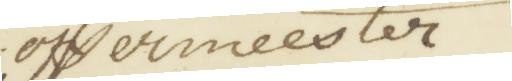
oppermeester
